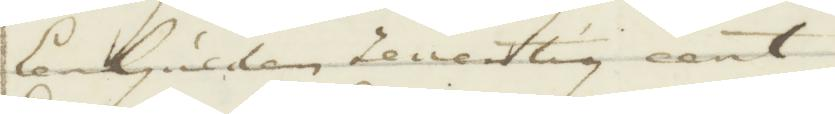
Een Gulden zeventig cent
